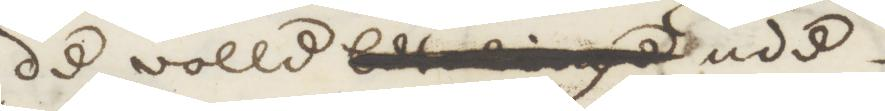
de volle betalinge Ende
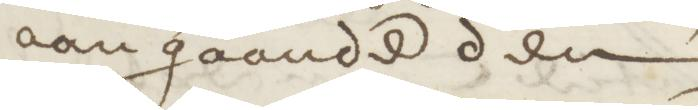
aangaande den
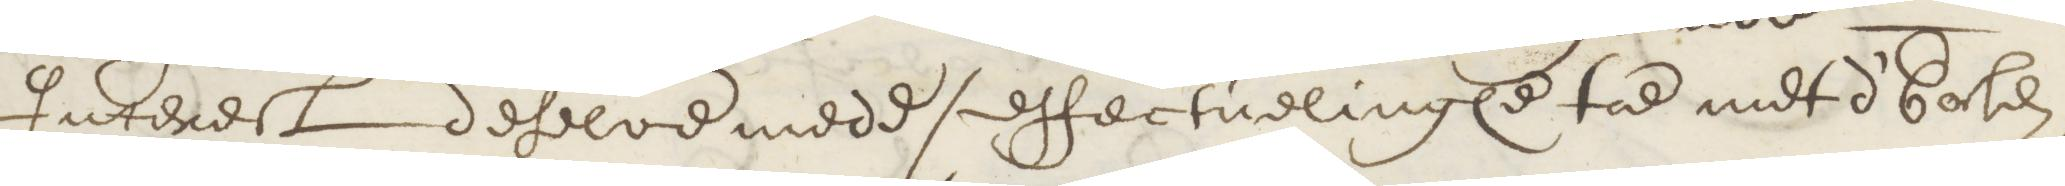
Jnterest deselve mede / effectuelinghe toe met d’ Costen
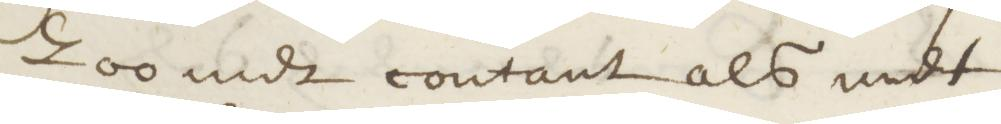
zoo met contant als met
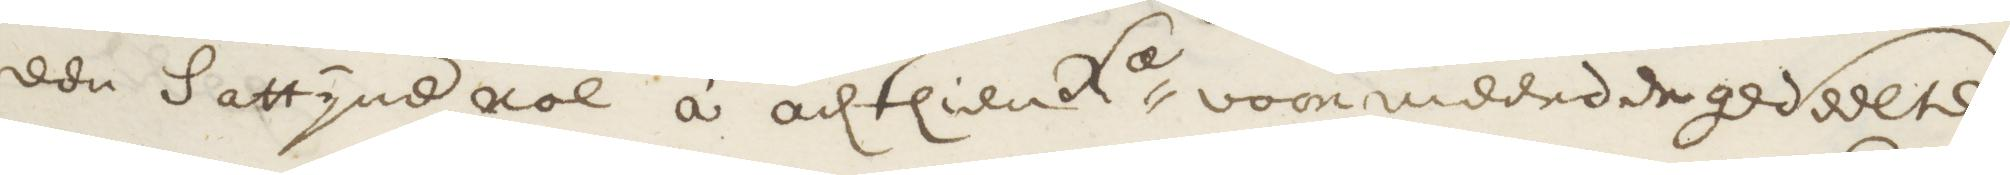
een sattijne rol a achthien R„a voor meerder gedeelte
